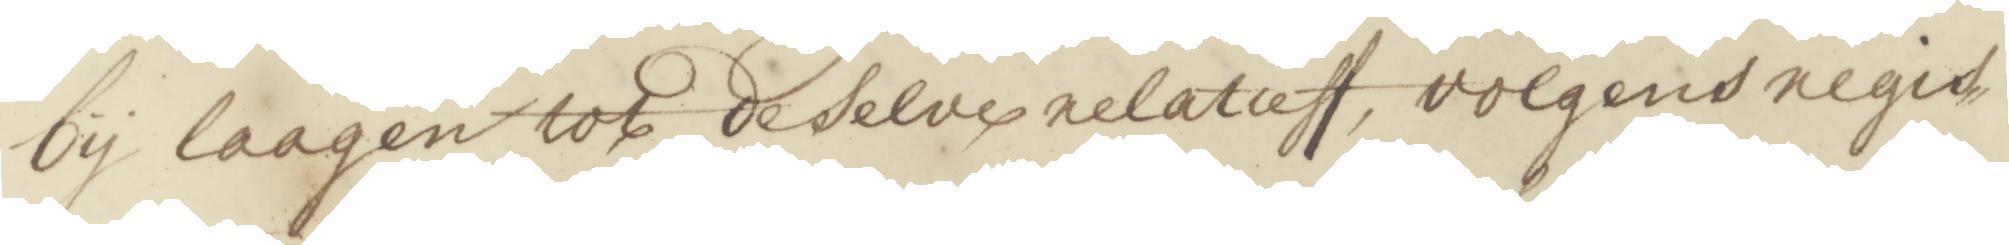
bij laagen tot deselve relatieff, volgens regis„
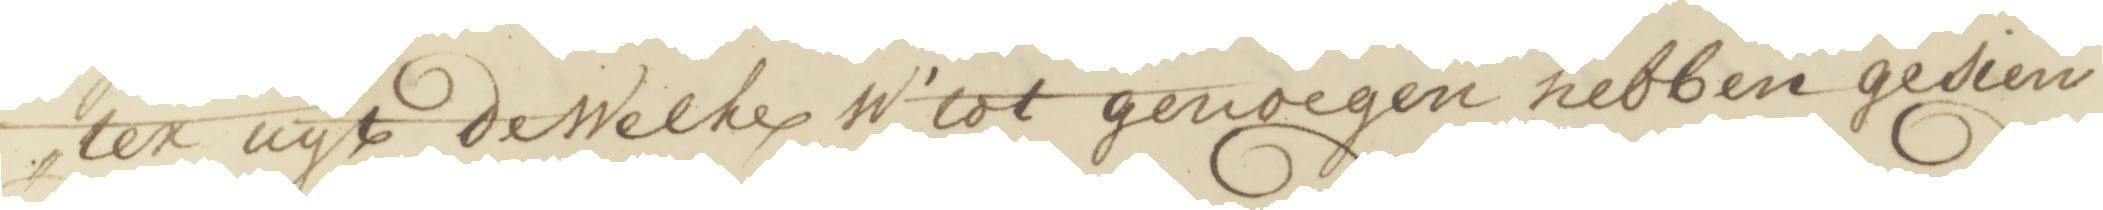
„ter uyt dewelke w' tot genoegen hebben gesien
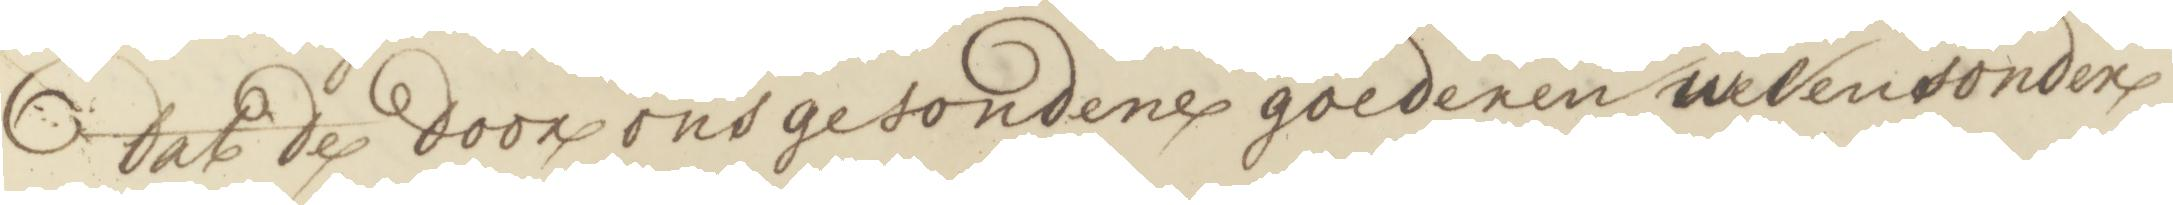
dat de door ons gesondene goederen wel en sonder
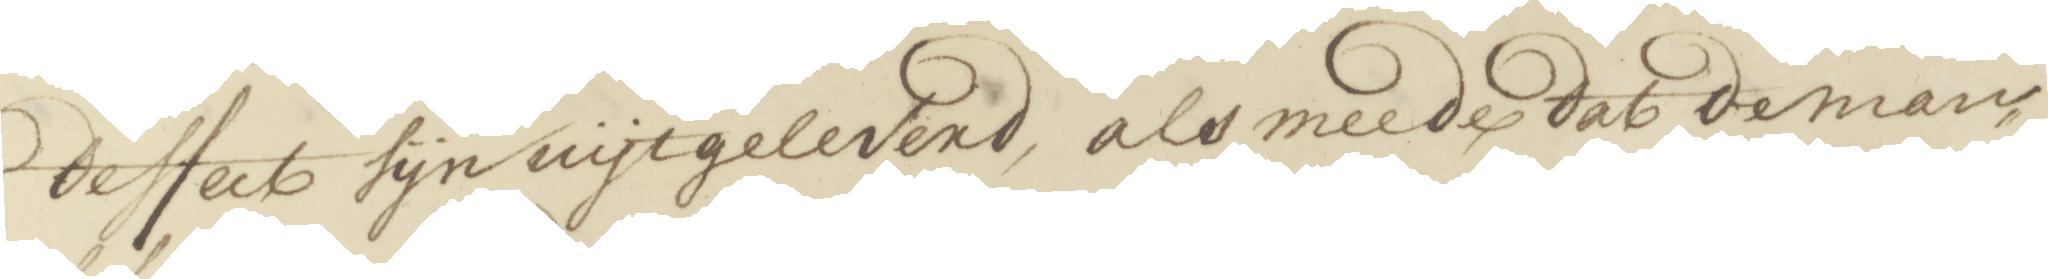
deffect sijn uijtgeleverd, als meede dat de man„
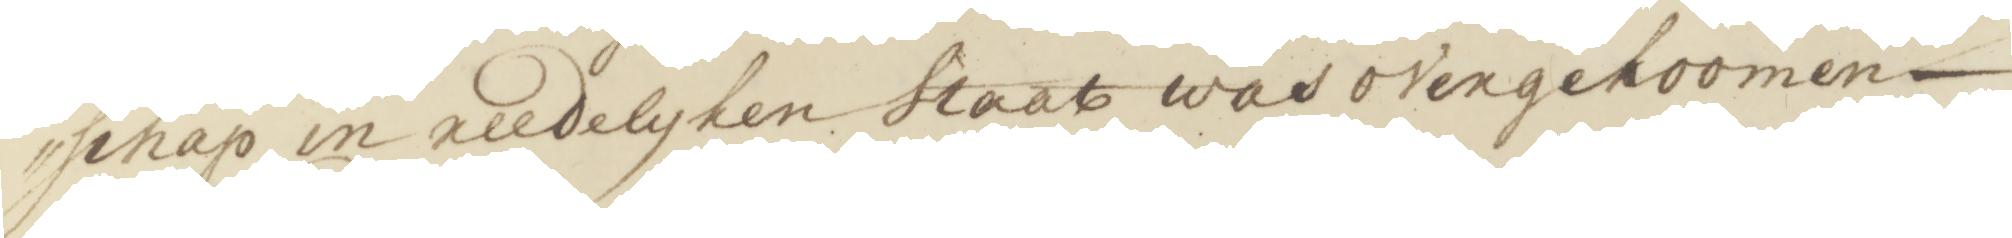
„schap in reedelyken staat was overgekoomen
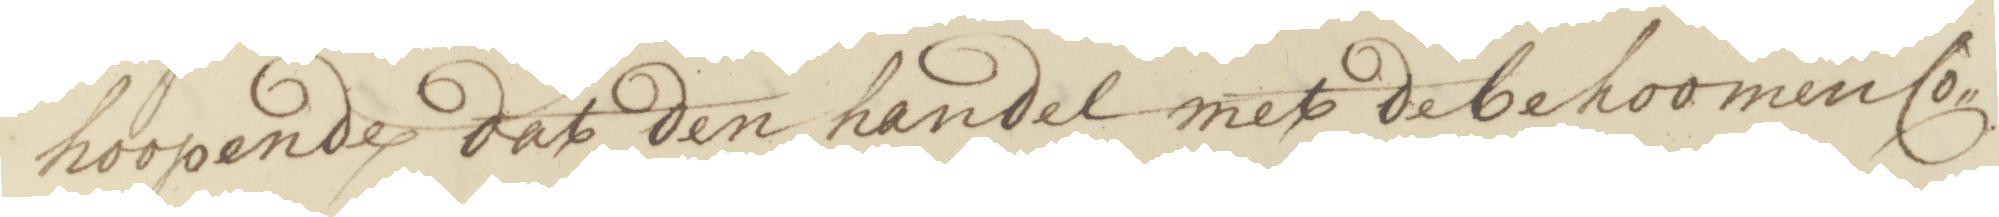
hoopende dat den handel met de bekoomen Co
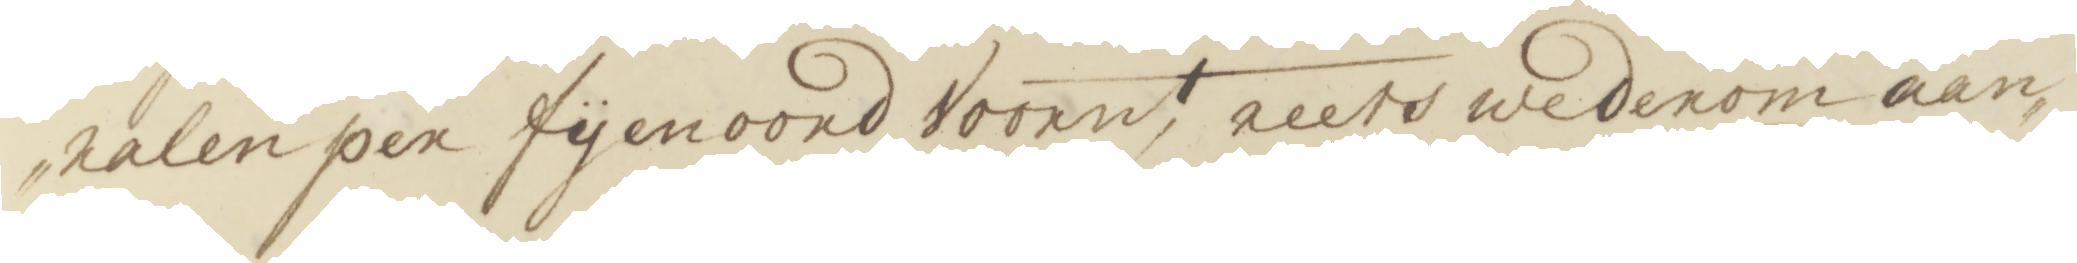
„ralen per fijenoord voorn,t reets wederom aan„
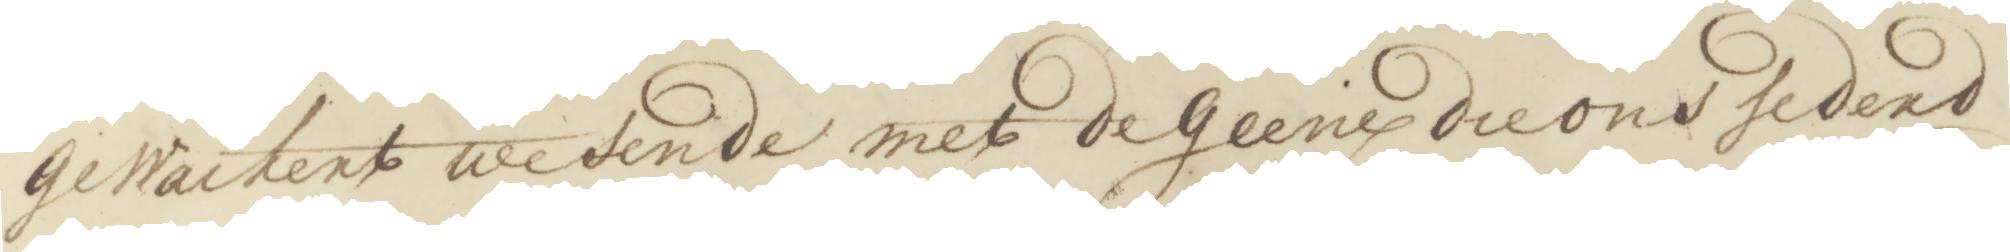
gewackert wesende met de geene die ons sederd
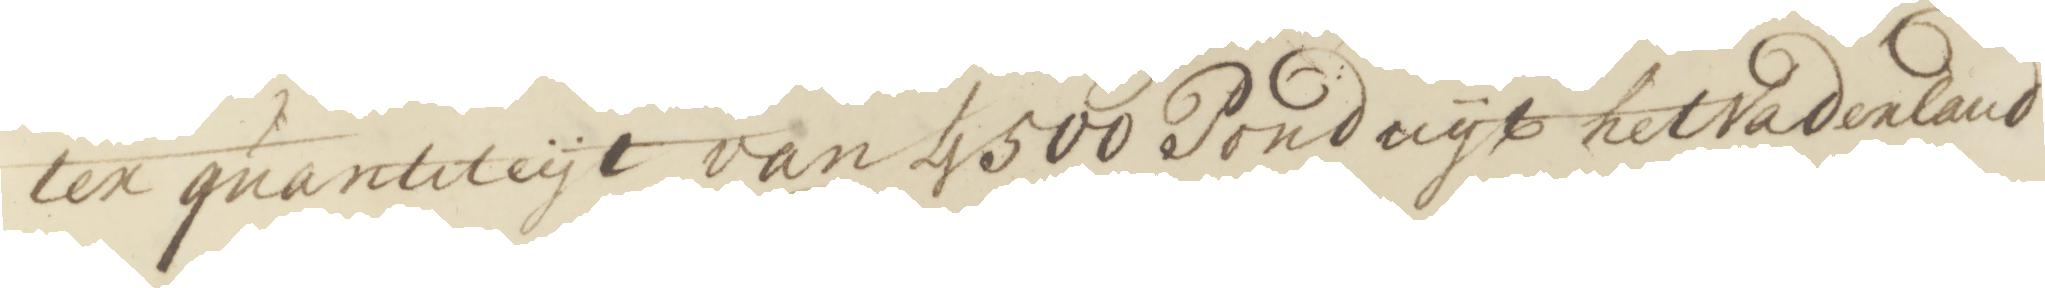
ter quantiteijt van 4500 Pond uijt het vaderland
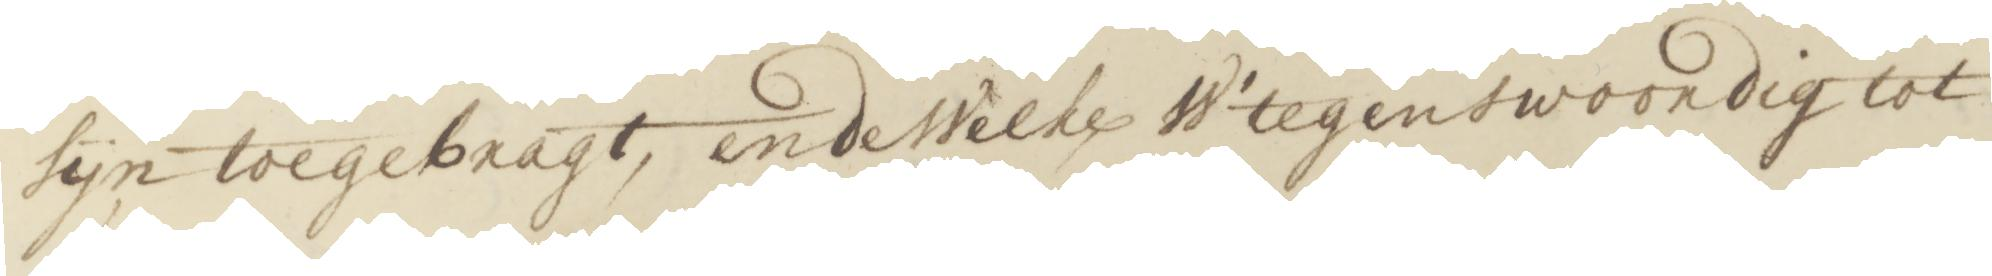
sijn toegebragt, en de welke w' tegenswoordig tot
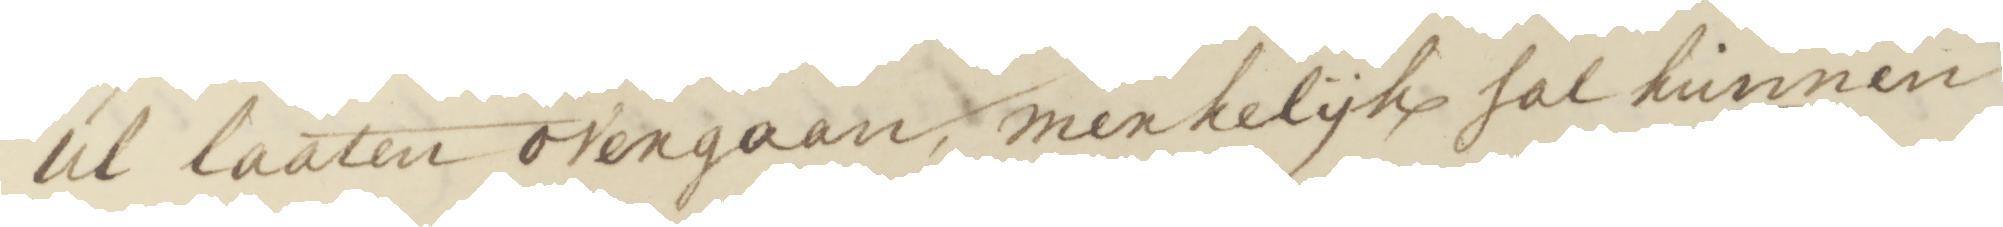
ul laaten overgaan, merkelijk sal kunnen
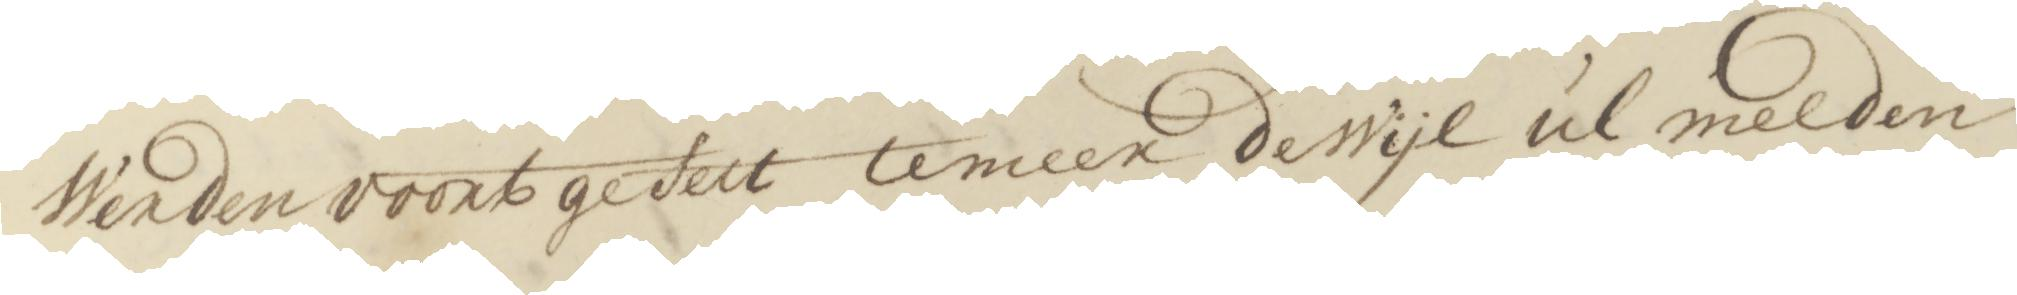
werden voort geseit temeer dewijl ul melden
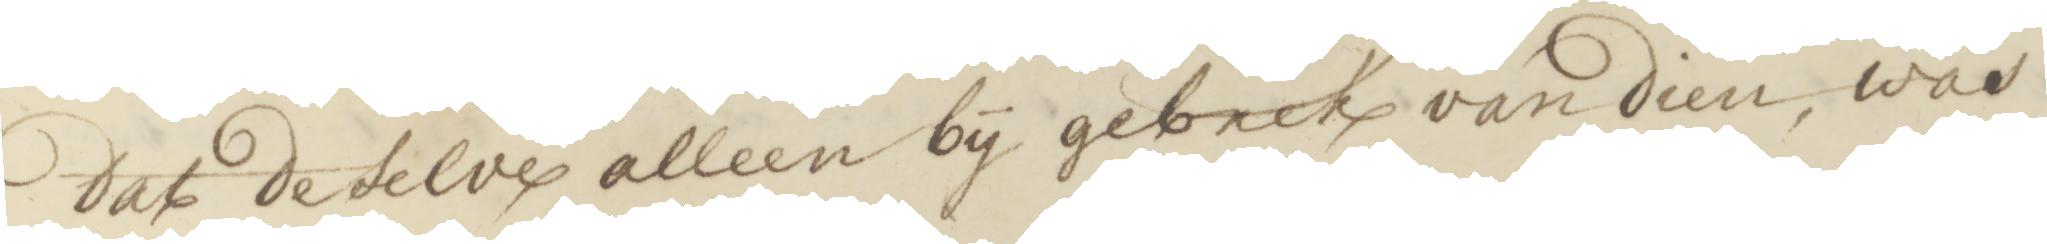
dat deselve alleen bij gebrek van dien, was
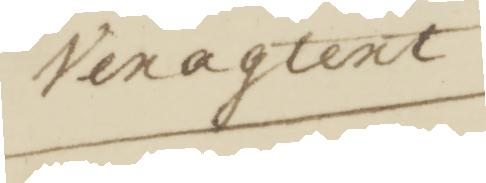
veragtert
